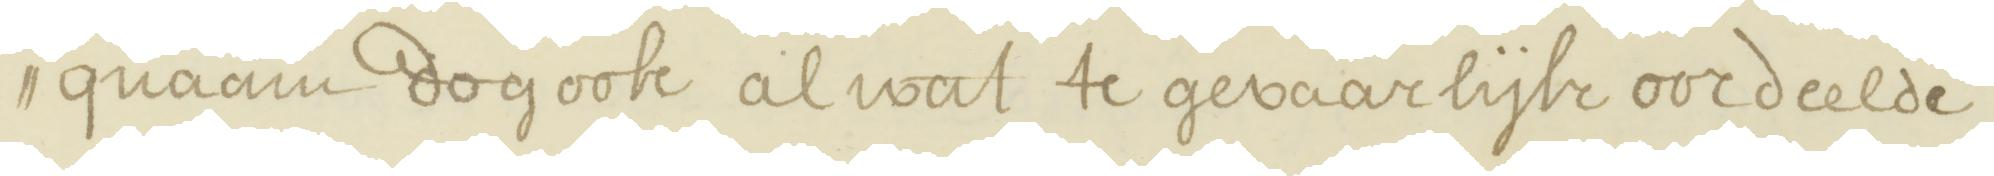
„quaam dog ook al wat te gevaarlijk oordeelde
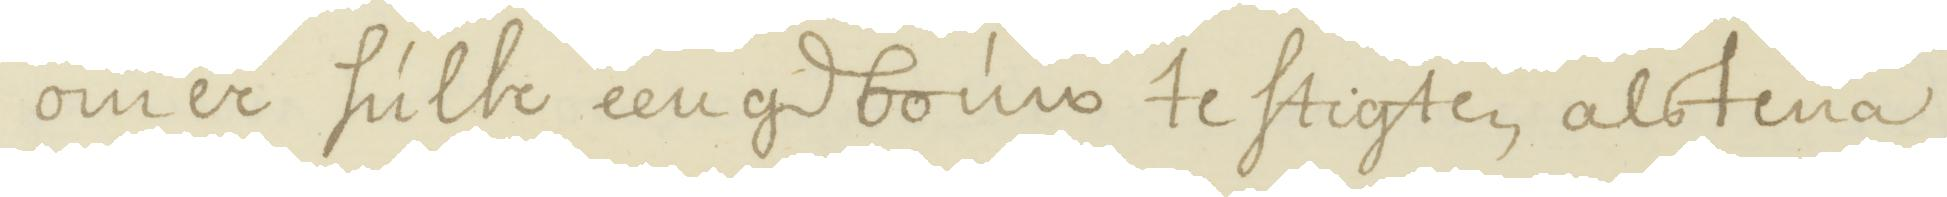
om 'er sulk een gebouw te stigten alstena
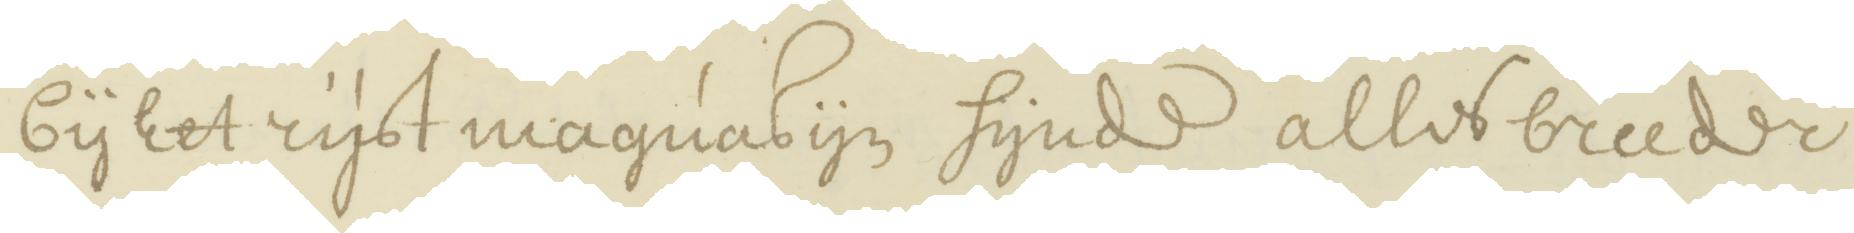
bij het rijst maguasijn sijnde alles breeder
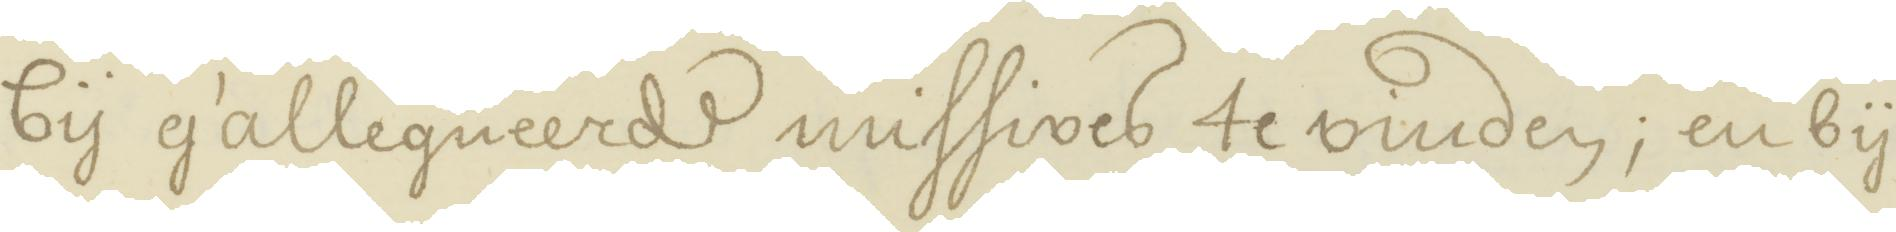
bij g’allegueerde missives te vinden; en bij
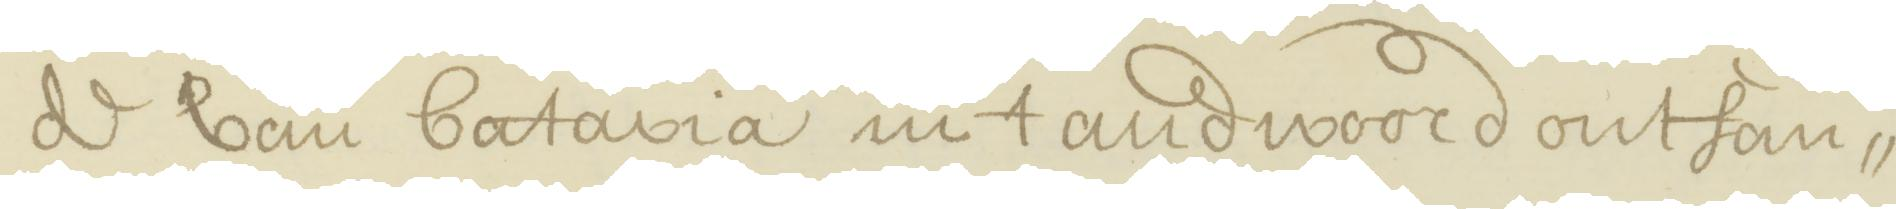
de van batavia in 't andwoord ontfan„
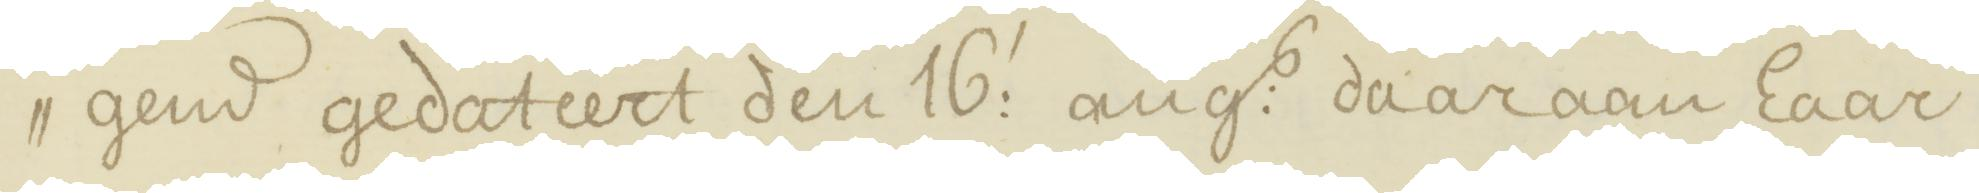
„gene gedateert den 16:' aug:s daar aan haar
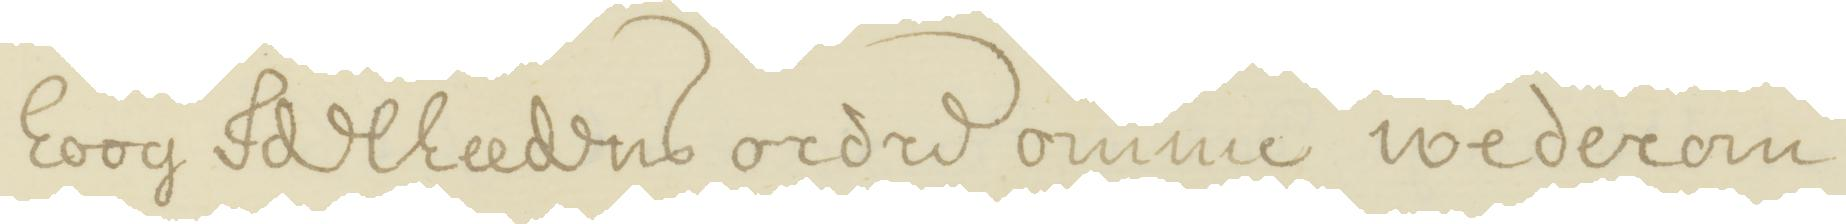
hoog Edelheedens ordre omme wederom
